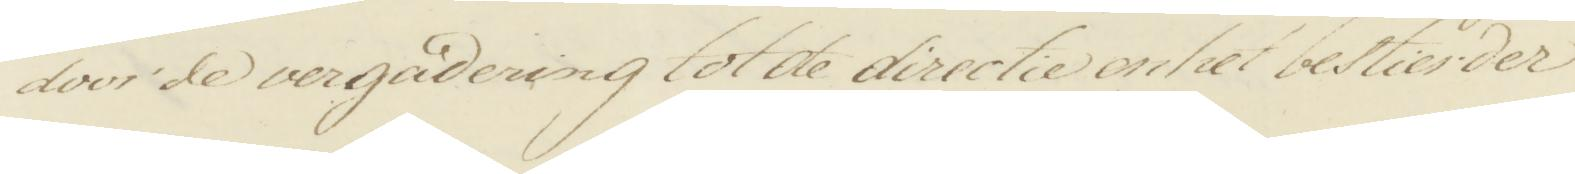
door de vergadering tot de directie en het bestierder
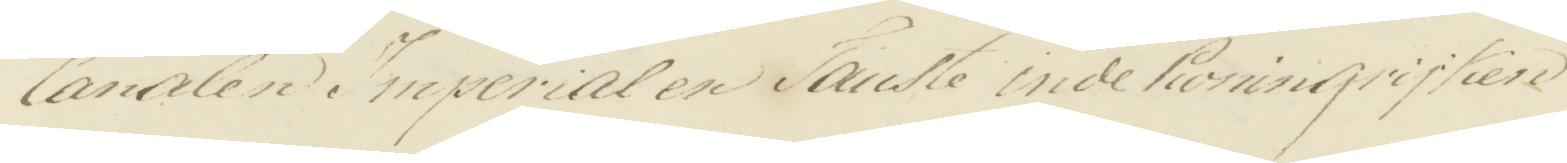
Canalen Imperial en Tauste in de Koningrijken
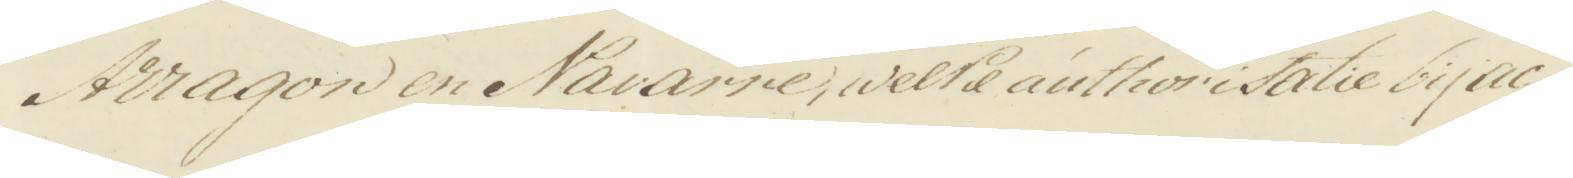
Arragon en Navarre, welke authorisatie bij ac
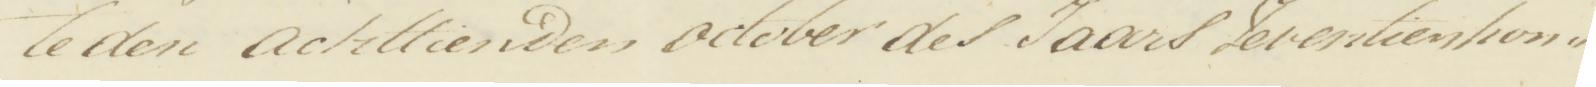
te den achttienden october des Iaars Zeventienhon„
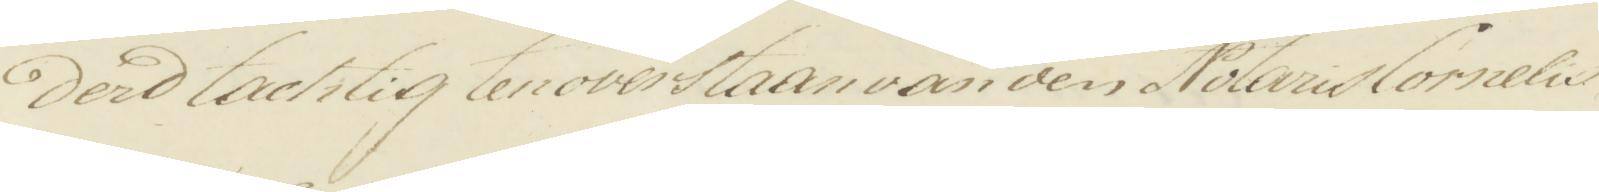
derd tachtig ten overstaan van den Notaris Cornelis
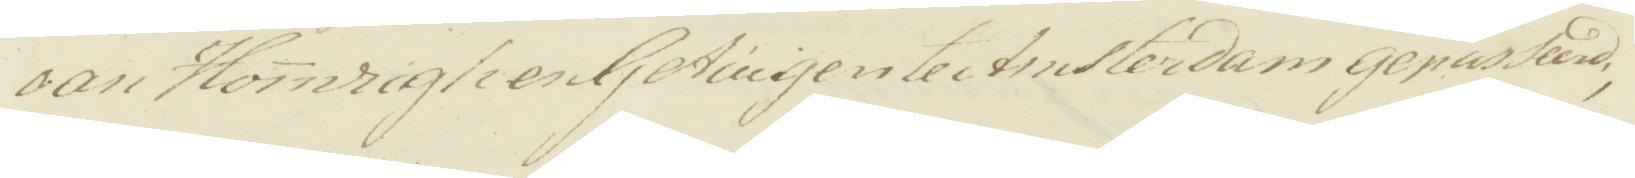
van Homrigh en Getuigen te Amsterdam gepasseerd,
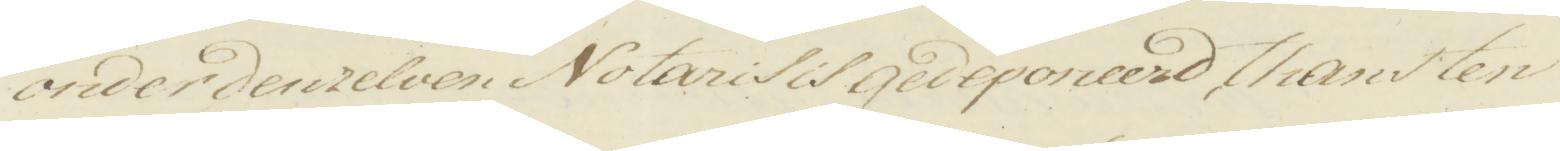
onder denzelven Notaris is gedeponeerd thans ten
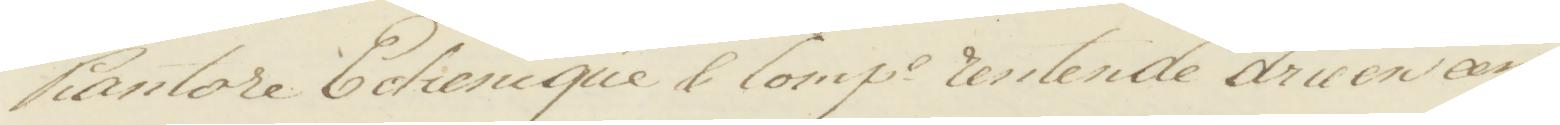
Kantore Echenique & Comp-o rentende drie en een
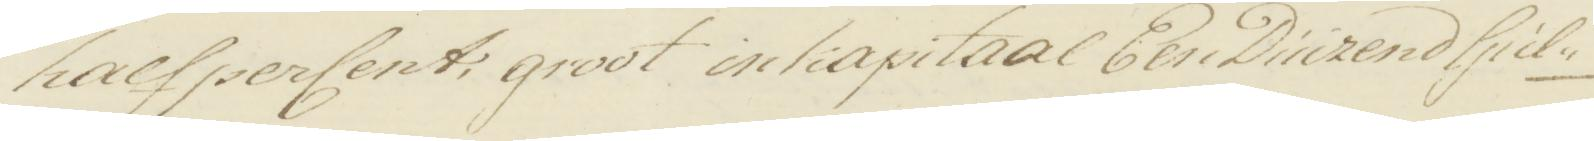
half percent. groot in kapitaal Een Duizend Gul„
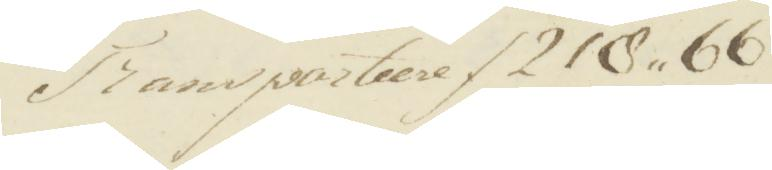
Transporteere ƒ 218„66
